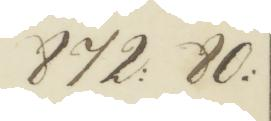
872: 80:
